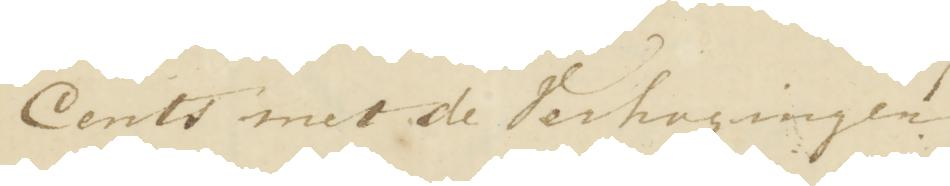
Cents met de Verhogingen.
